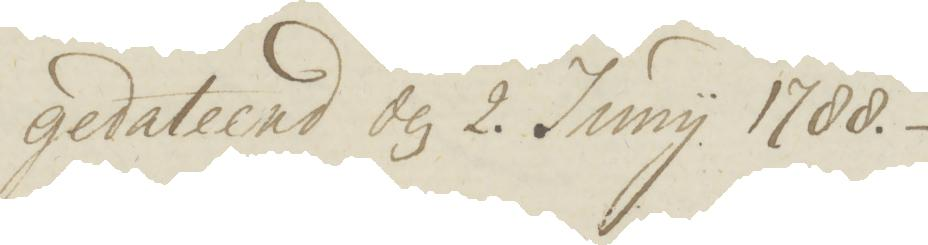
gedateerd den 2. Junij 1788.-.
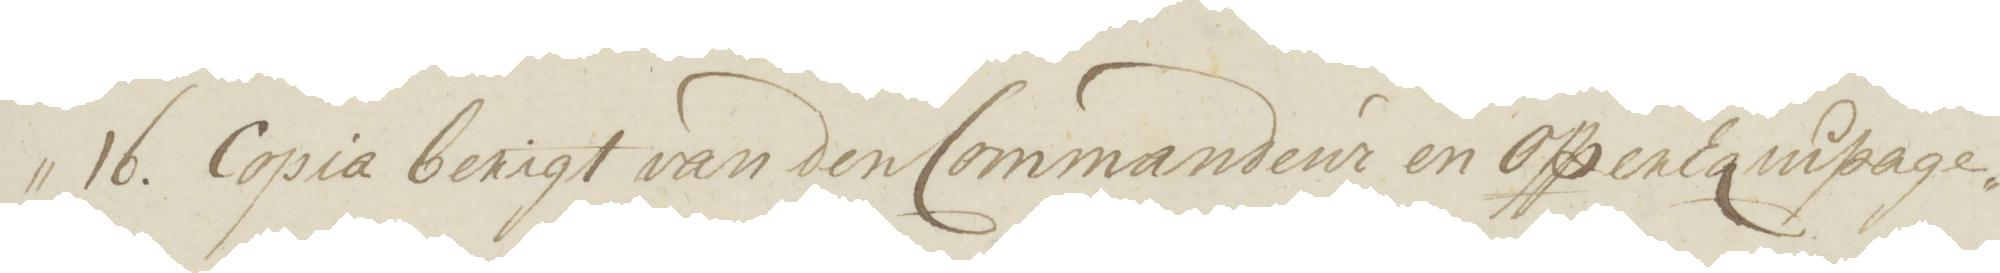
„ 16. Copia berigt van den Commandeur en Opper Equipage„
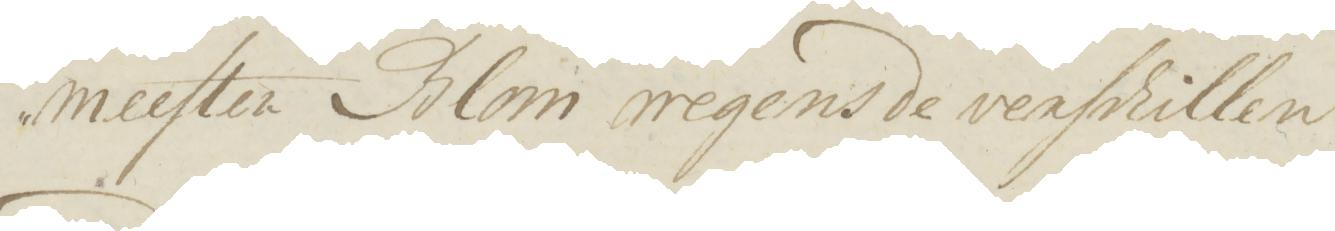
meester Blom wegens de verschillen
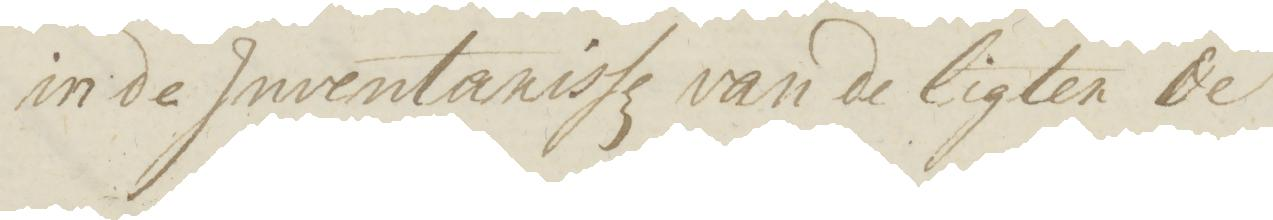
in de Inventarissen van de ligter de
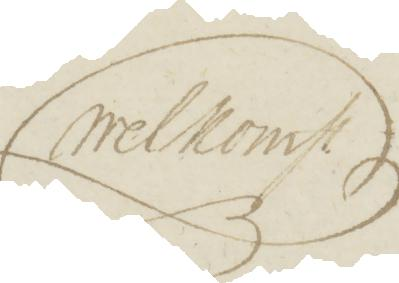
welkomst
